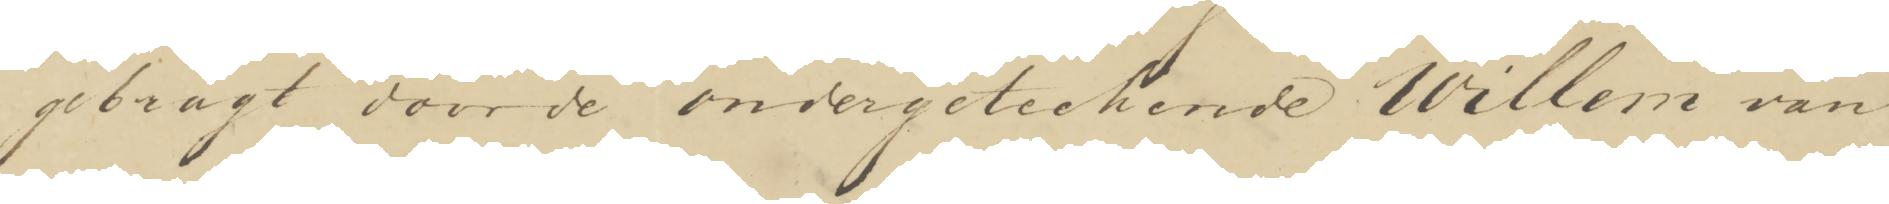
gebragt door de ondergeteekende Willem van
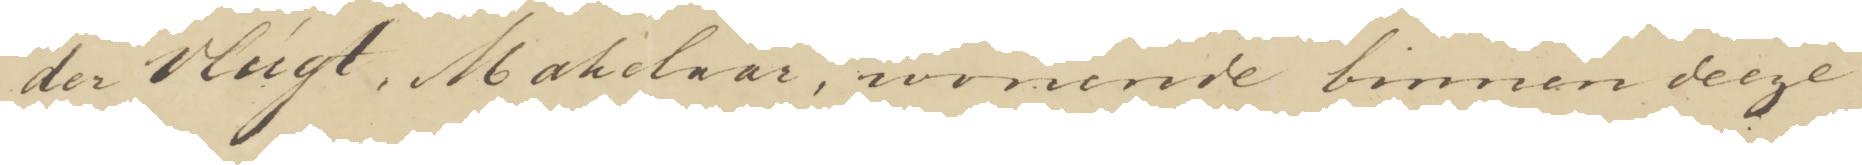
der Vlugt, Makelaar, wonende binnen deeze
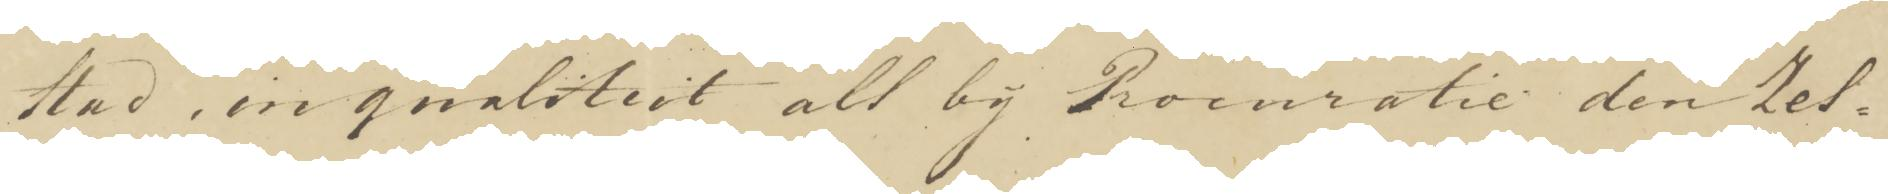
stad, in qualiteit als bij Procuratie den zes„
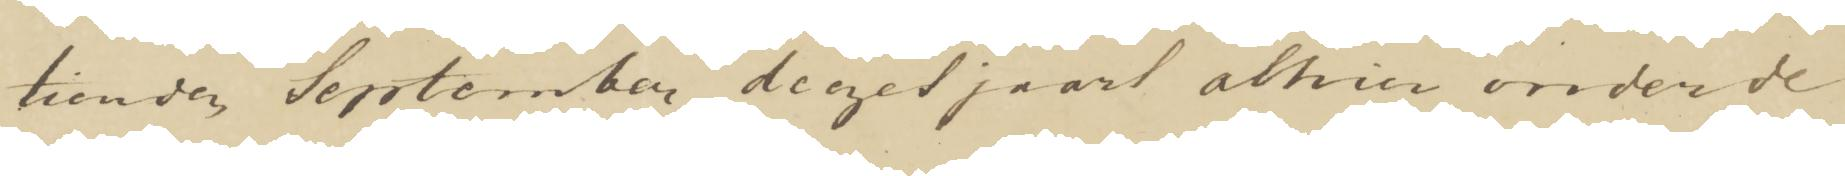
tienden september deezes jaars alhier onder de
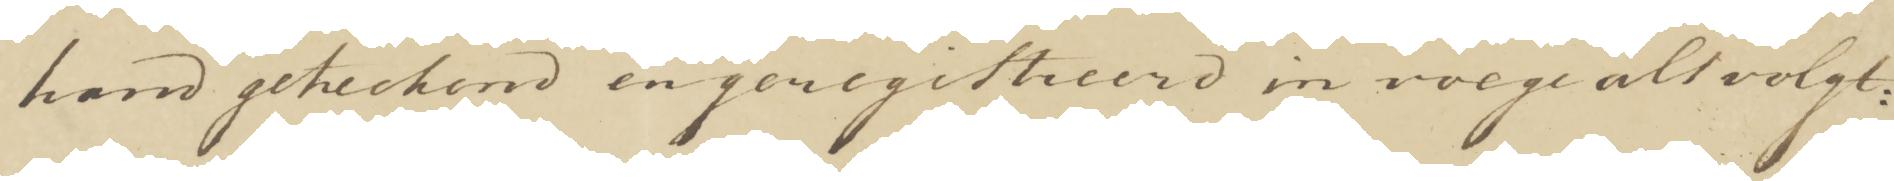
hand geteekend en geregistreerd in voege als volgt:
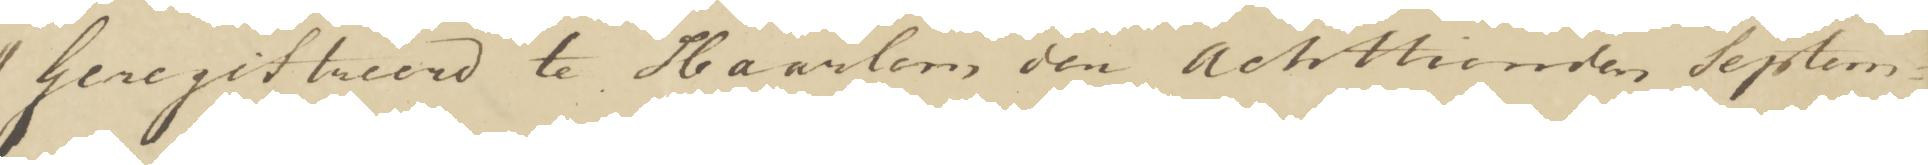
"Geregistreerd te Haarlem den achttienden septem
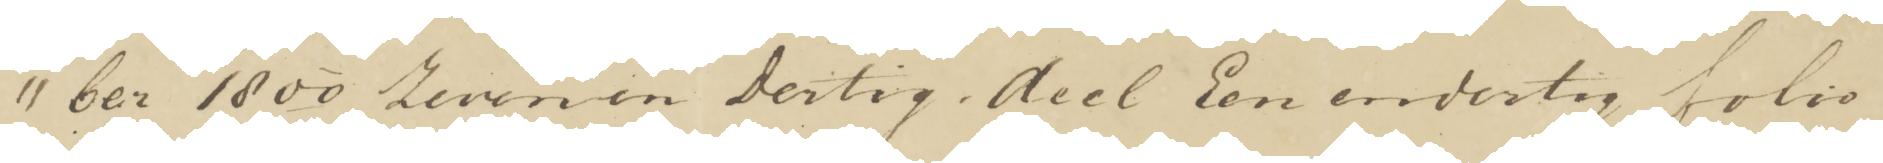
„ber 1800 zevenen Dertig, deel Een endertig folio
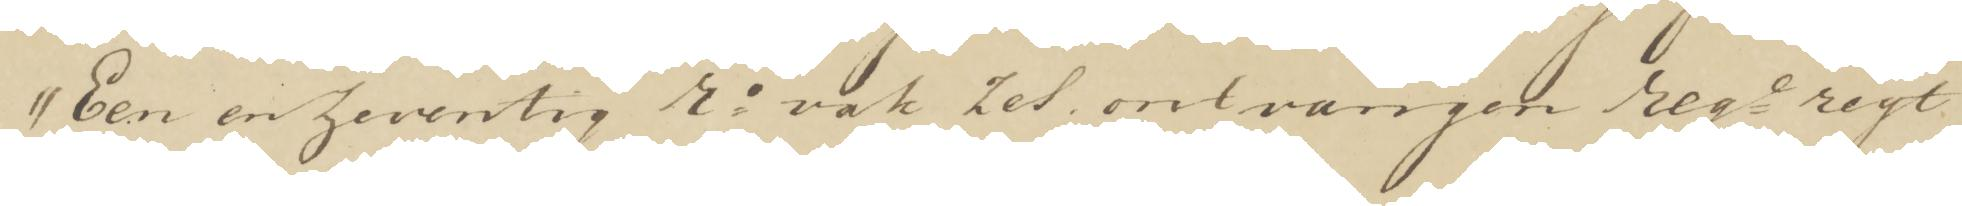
„ Een en zeventig r=o vak zes, ontvangen reg=e regt
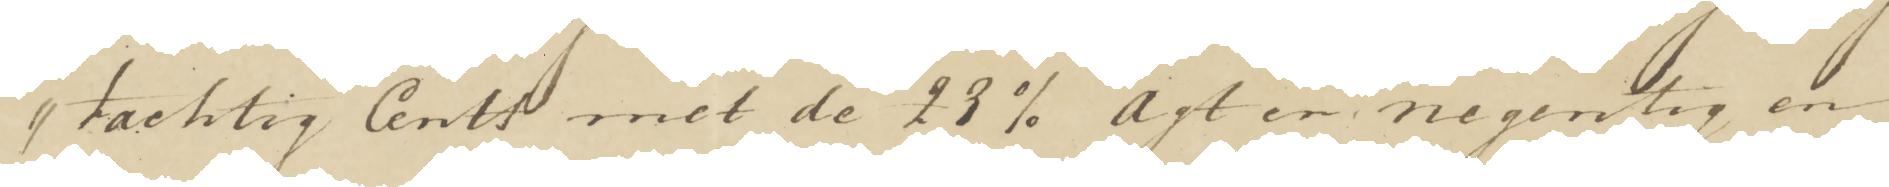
„tachtig Cents met de 23% agten negentig en
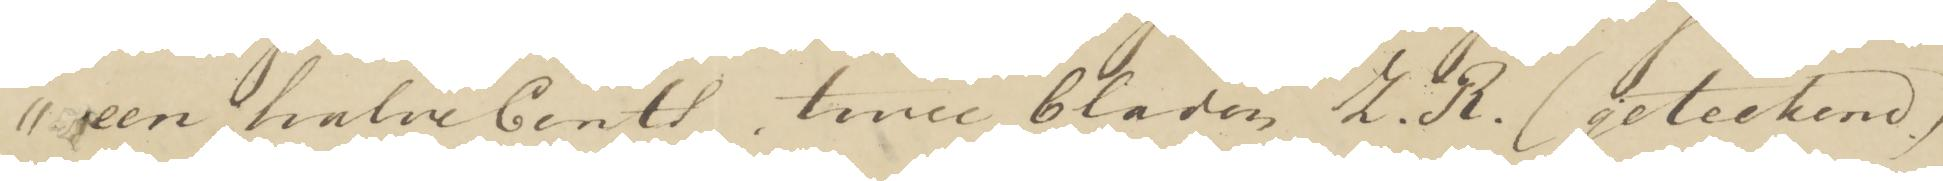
„een halve Cents, twee bladen Z.R. (geteekend.)
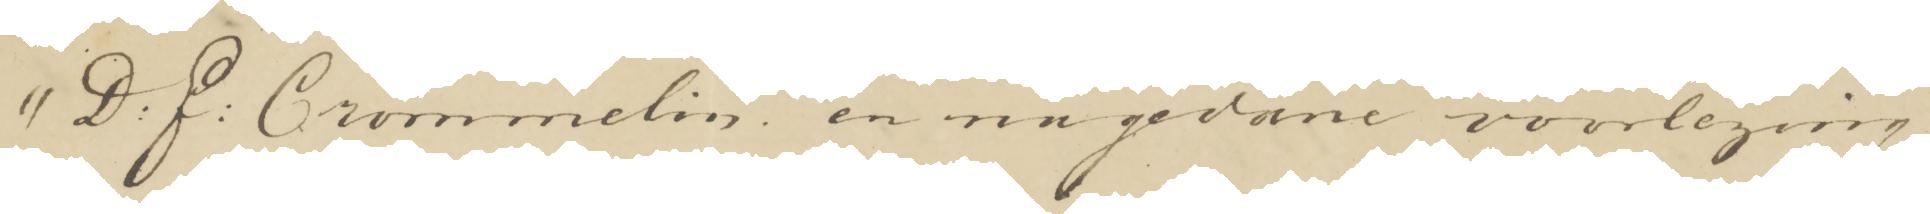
„ D:F: Crommelin." en na gedane voorlezing
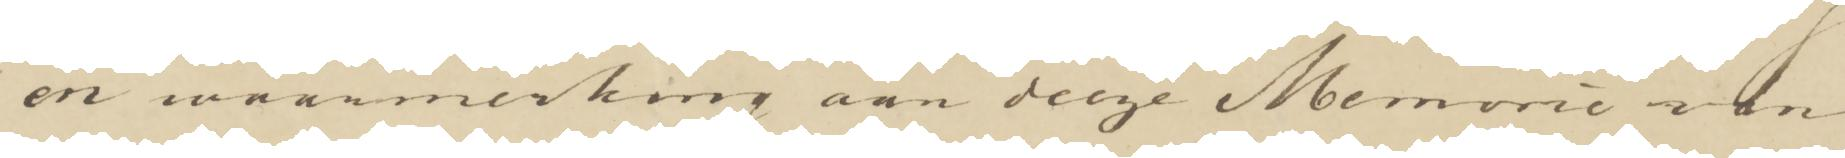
en waarmerking aan deeze Memorie van
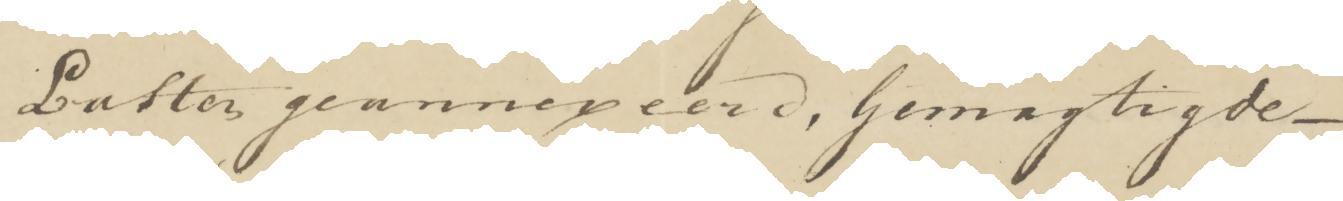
Lasten geannexeerd, Gemagtigde
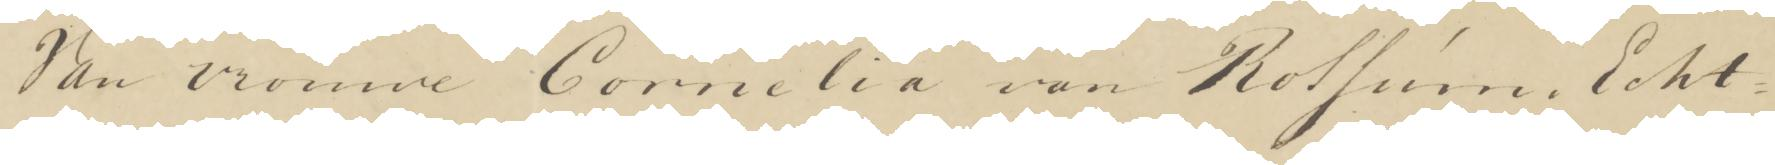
Van vrouwe Cornelia van Rossum, Echt=
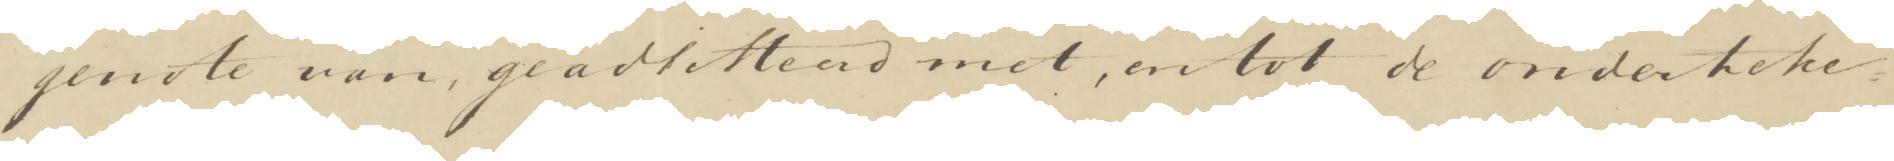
genote van, geadsisteerd met, en tot de onderteke=
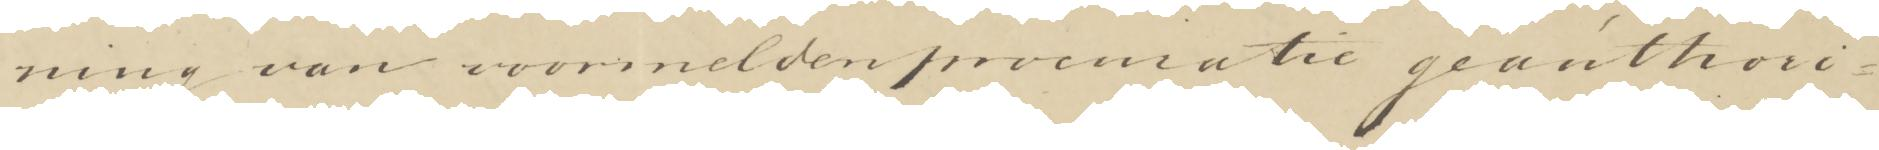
ning van voormelden procuratie geauthori=
